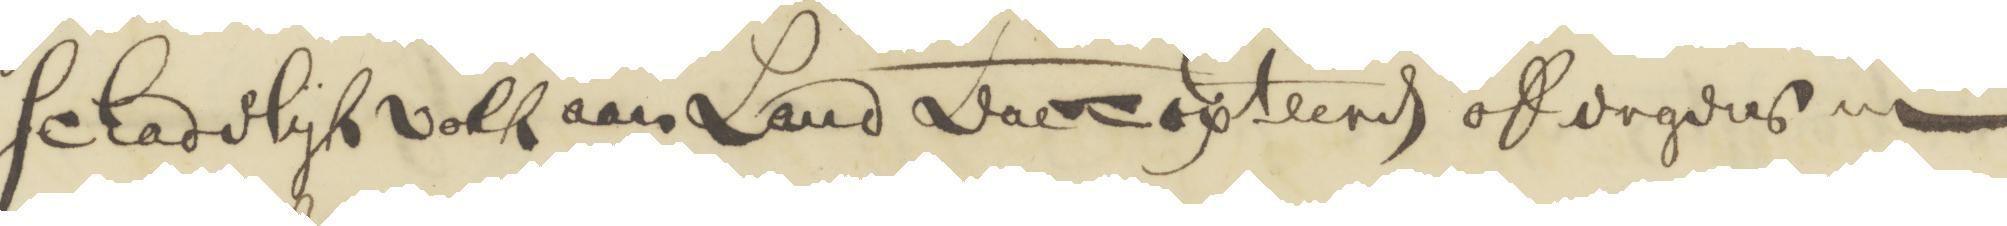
Schadelijk volk aan Land Te accepteeren of ergens in
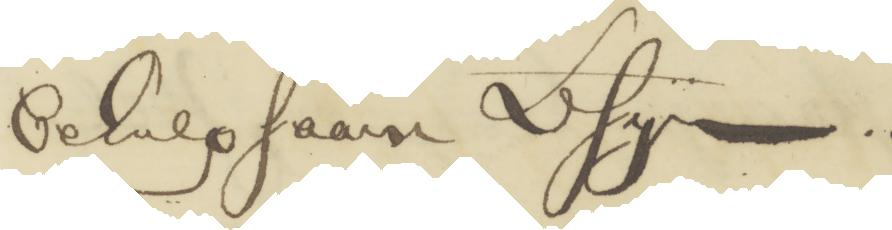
behulpsaam Te Sijn.
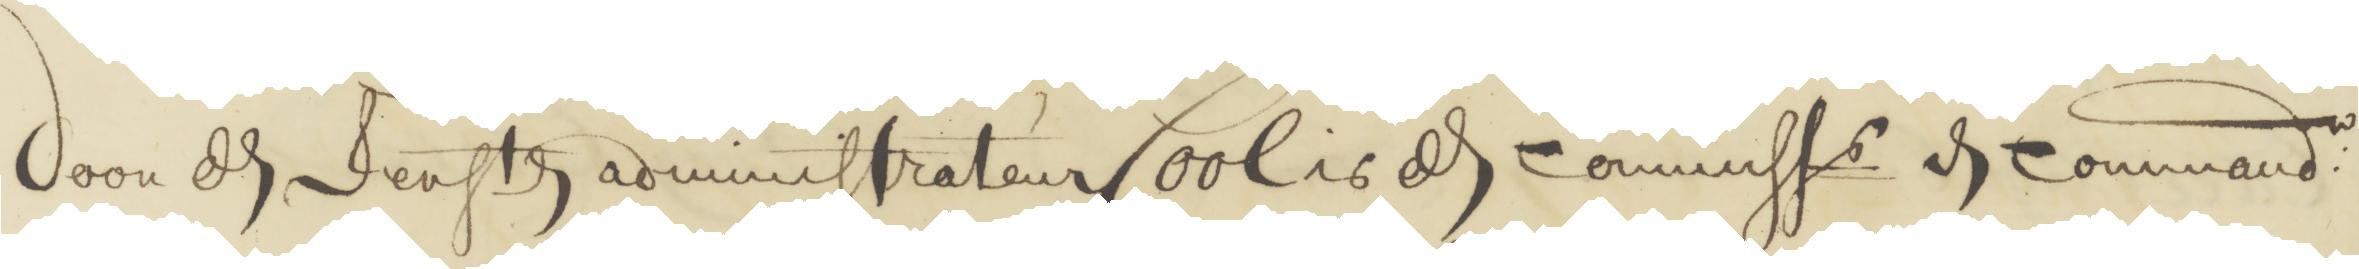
door den Eersten administrateur Cool is den commiss=s en command:r
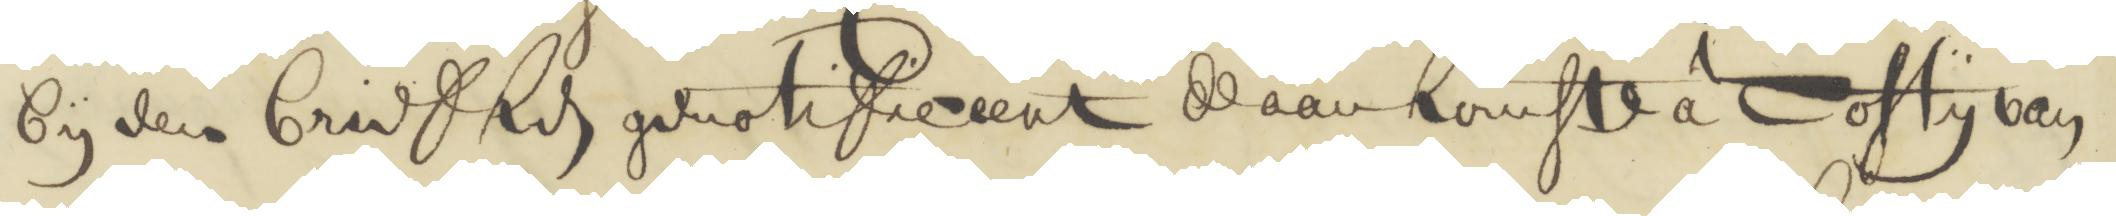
bij een briefken genotificeert de aan komste â Costij van
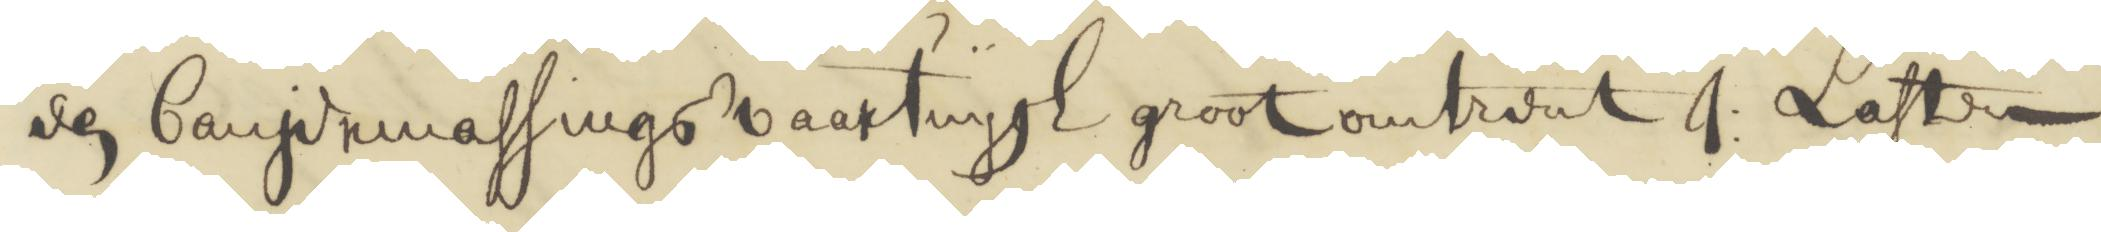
een banjermassings vaartuijgh groot omtrent 4: Lasten
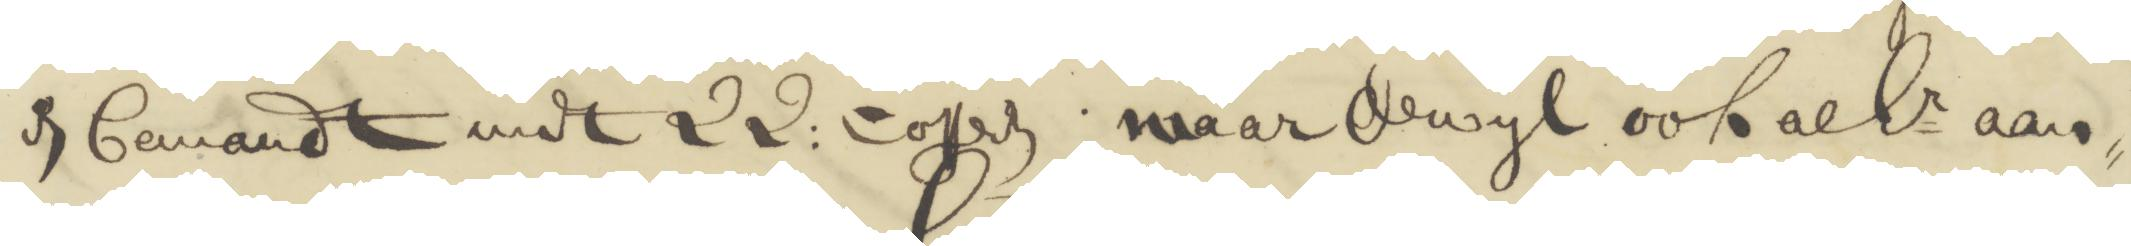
en bemandt met 22: coppen; waar dewijl ook alh=r aan„
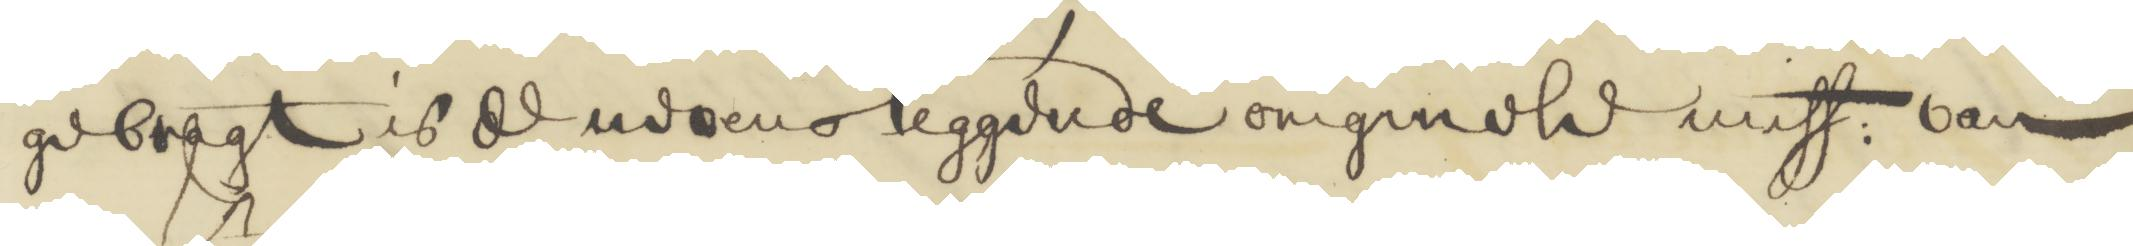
gebragt is de nevens leggende originele miss: van
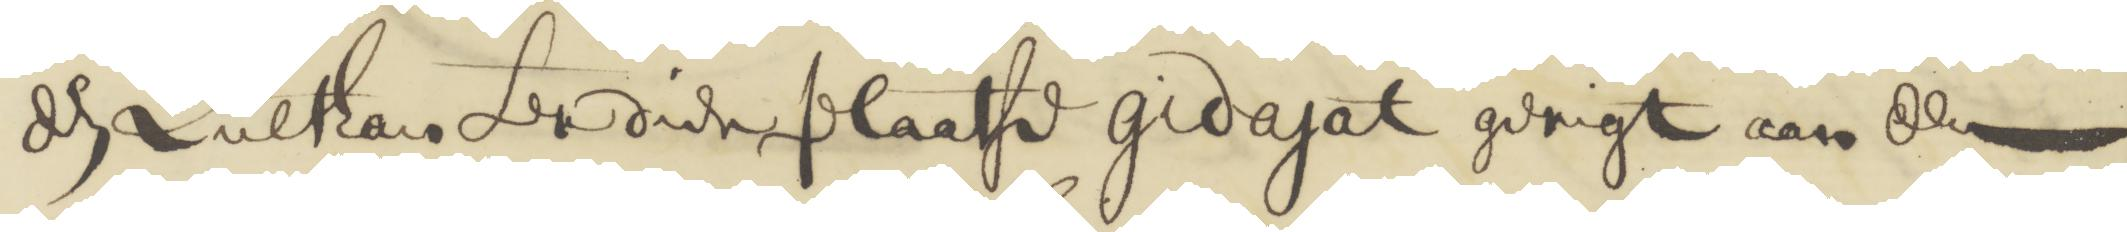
den Zulthan Ter dier plaatse gidajat gerigt aan den
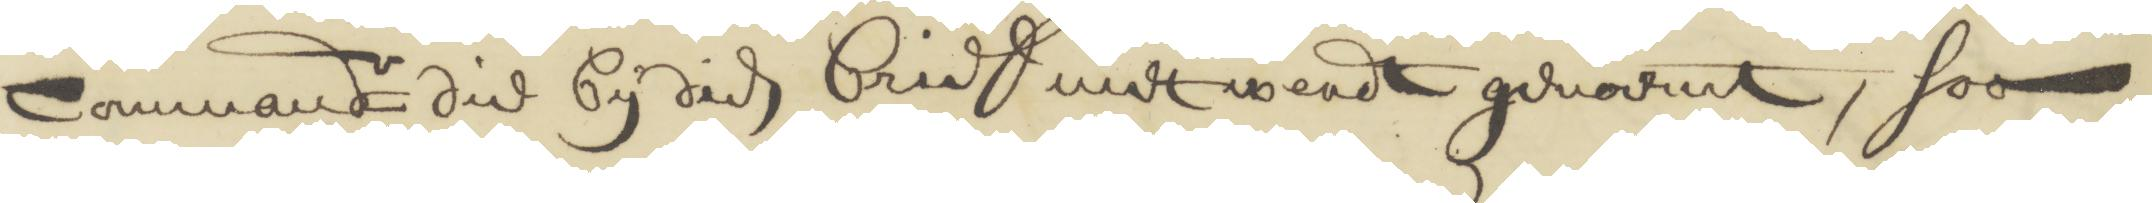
Command=r die bij dien brief niet werdt genoemt, Soo
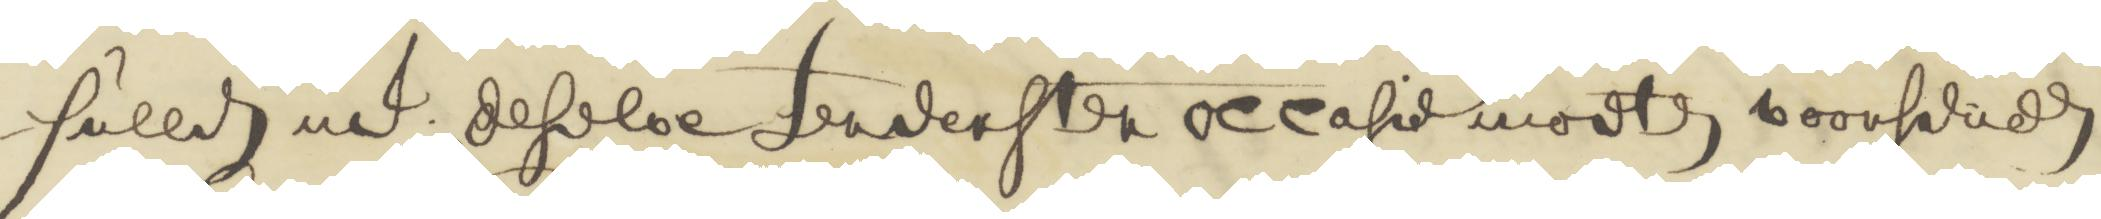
Sullen uE: deselve Ter eerster occasie moeten voorsenden
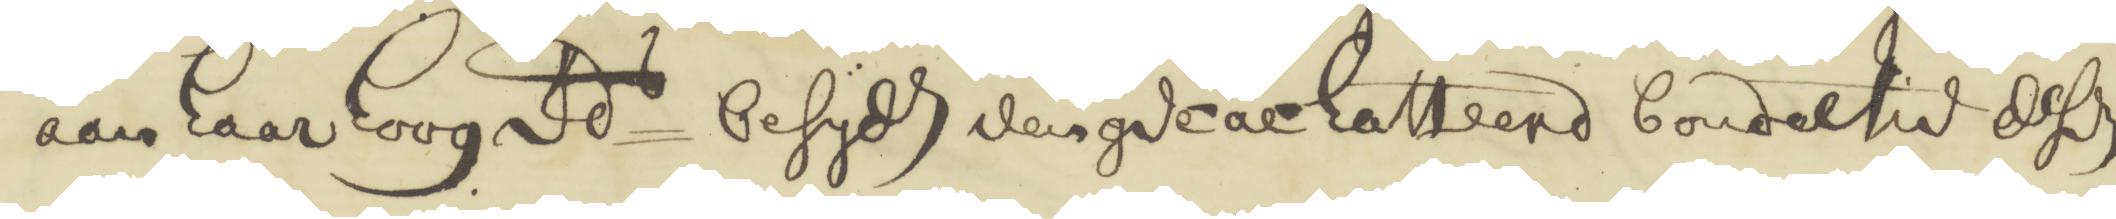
aan haar hoog Ed=s besijden een gecachatteerd bondeltie desen
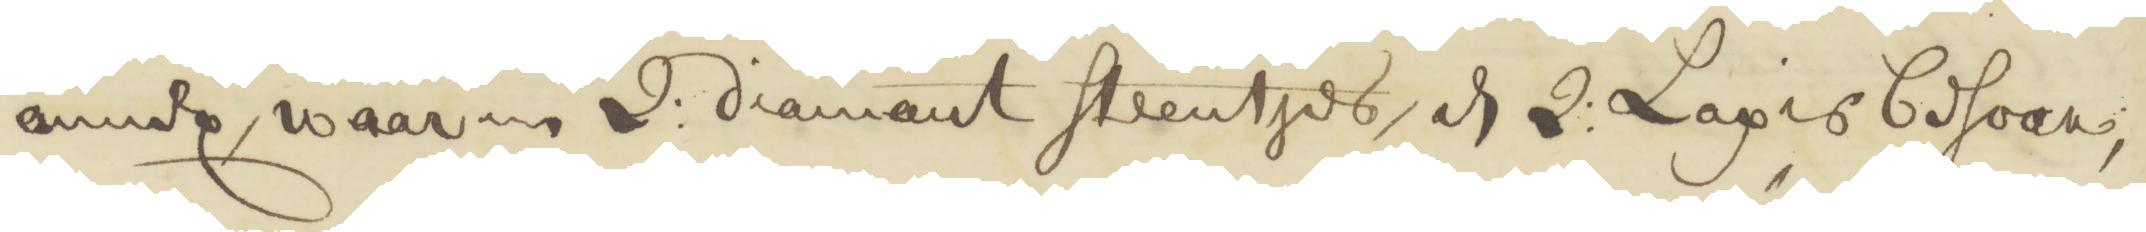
annex, waarin 2: diamant Steentjes, en 2: Lapis besoar;
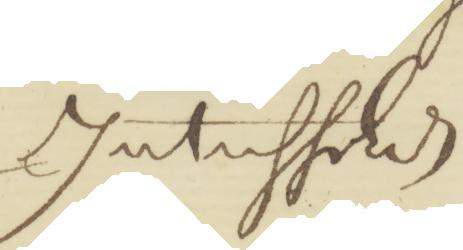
Jntusschen
